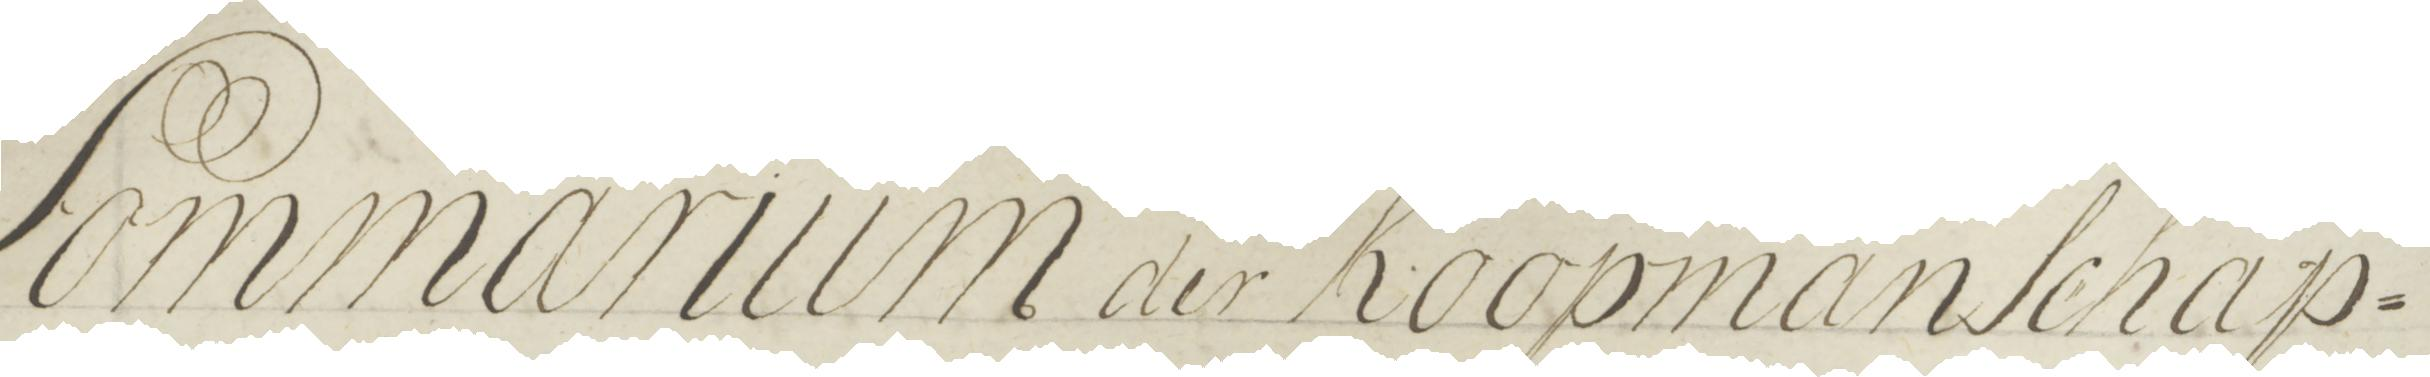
Sommarium der Koopmanschap=
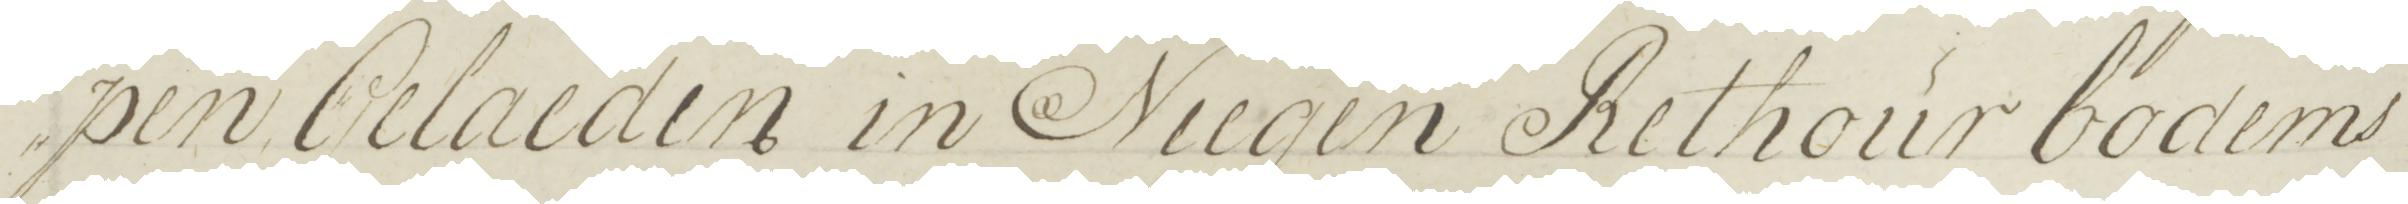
„pen Gelaeden in Neegen Rethour bodems
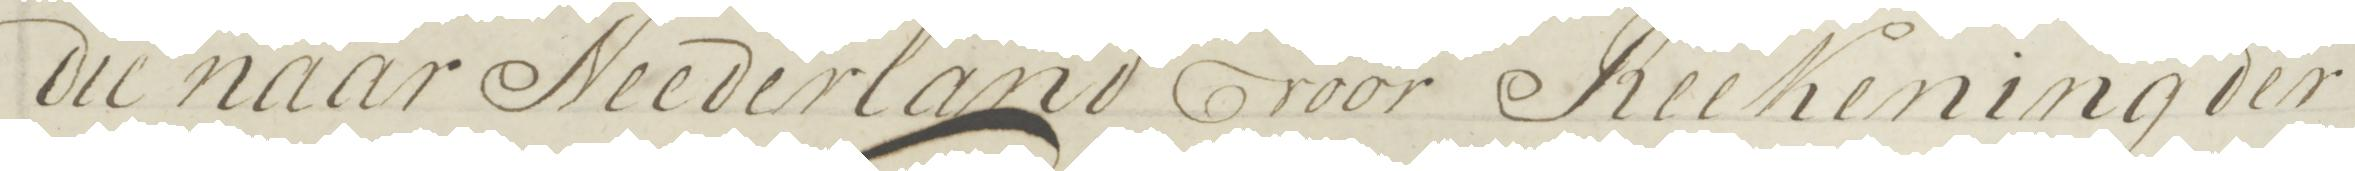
die naar Neederland voor Reekening der
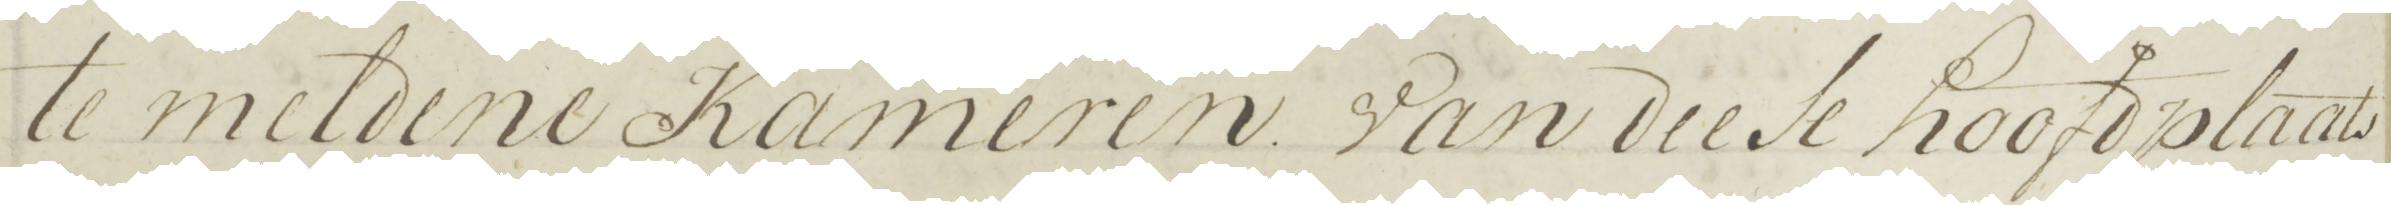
te meldene Kameren van deese hoofdplaats
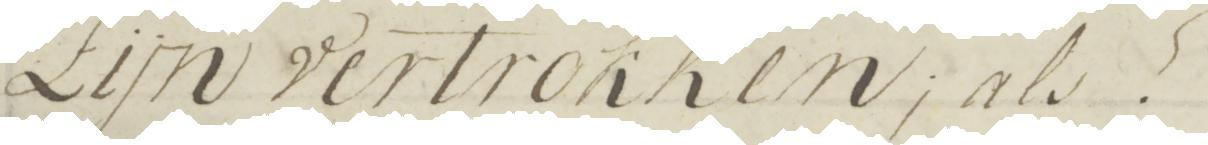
zijn vertrokken; als :
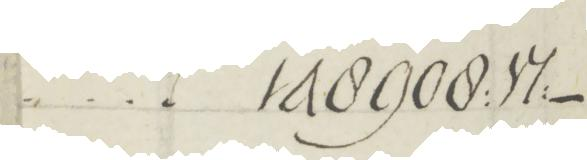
ƒ 148908:17:–
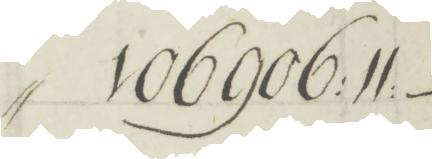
„ 106906:11:–
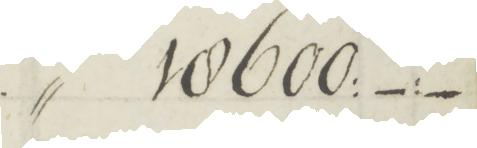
„ 18600:–:–
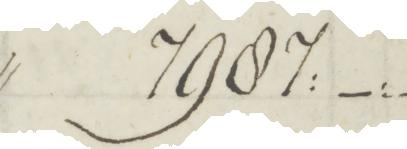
„ 7987:–:
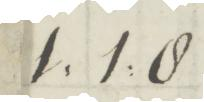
1:1:8
